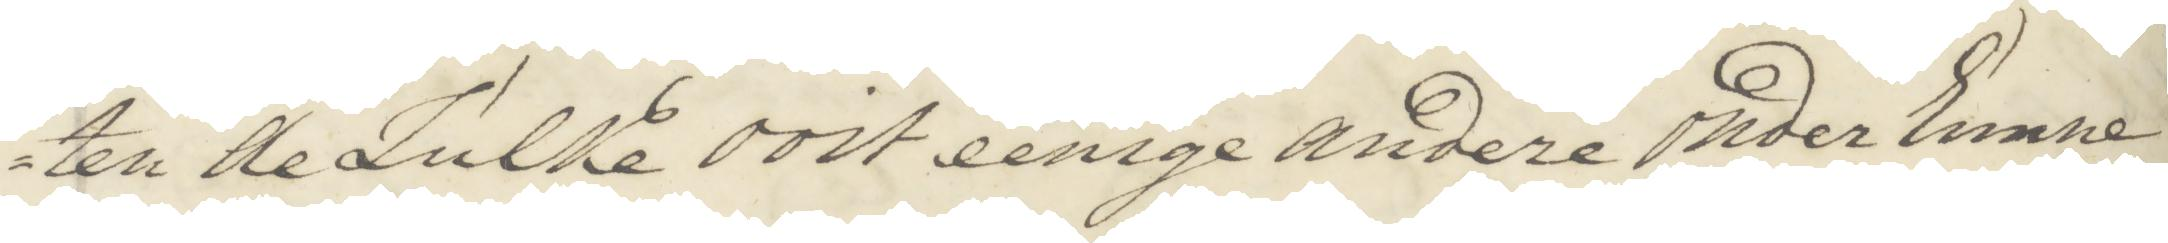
„ten de zulke ooit eenige andere onder hunne
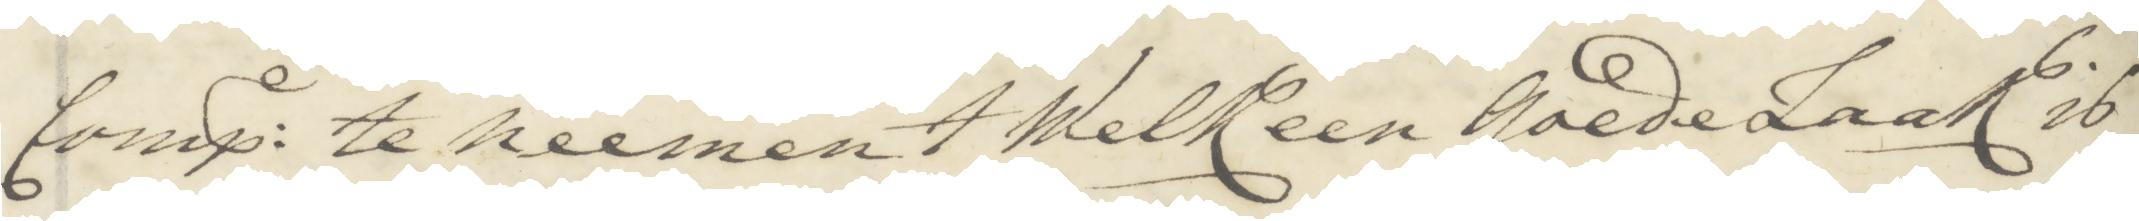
Comp:e te neemen 't welk een Goede zaak is
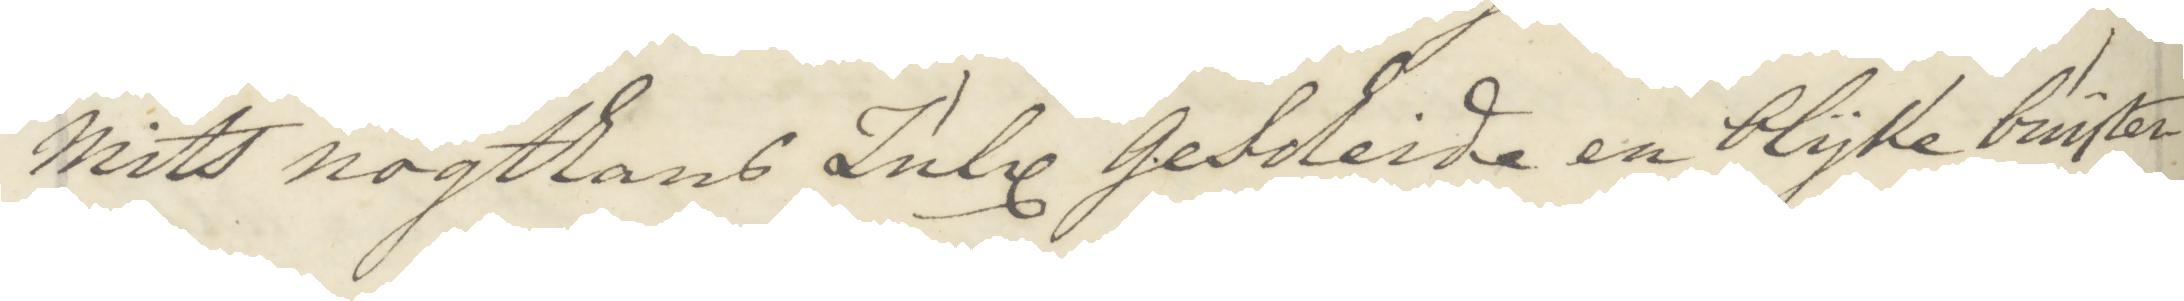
mits nogthans zulx gescheide en blijke buijten
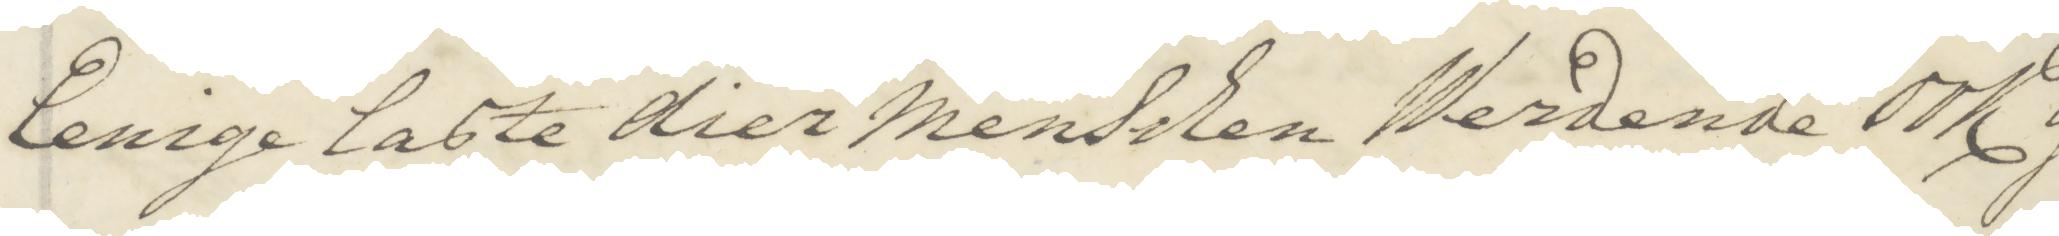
Eenige laste dier menschen werdende ook
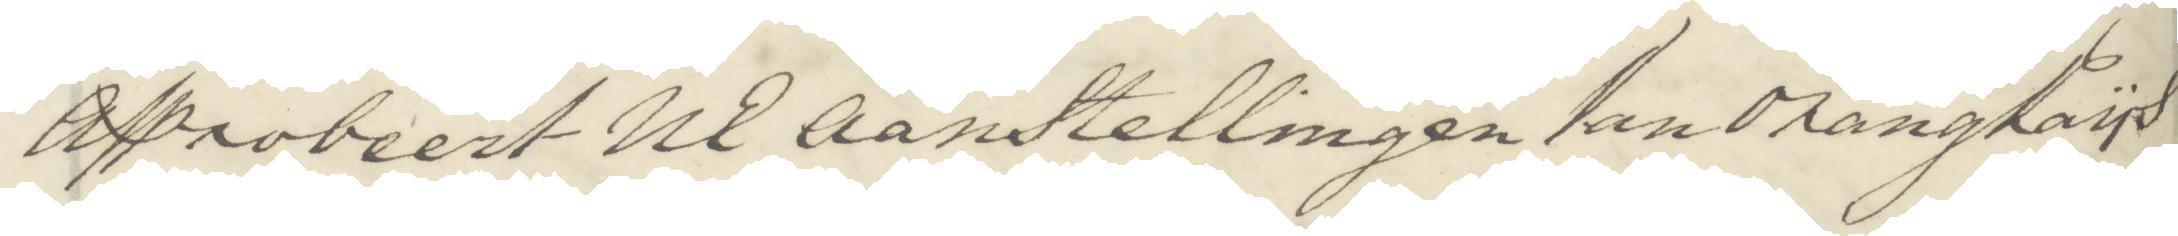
approbeert UE aanstellingen van orangkaijs
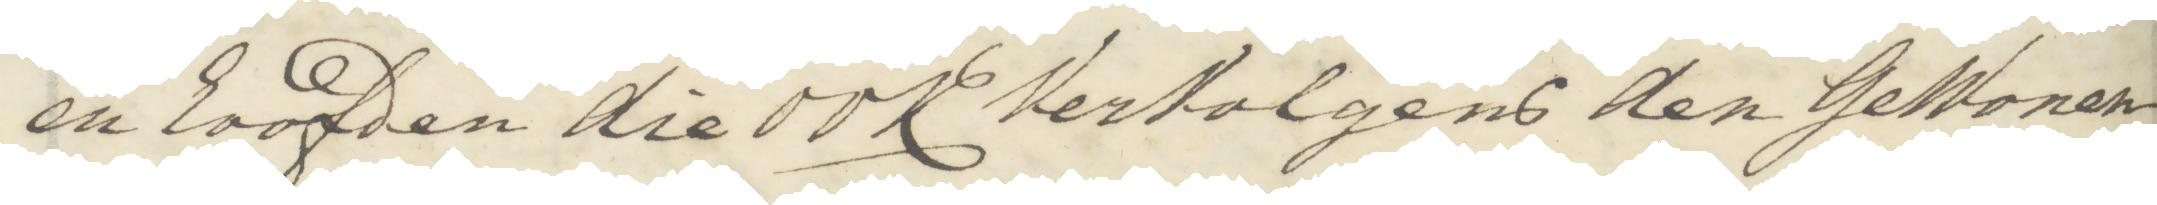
en hoofden die ook vervolgens den gewonen
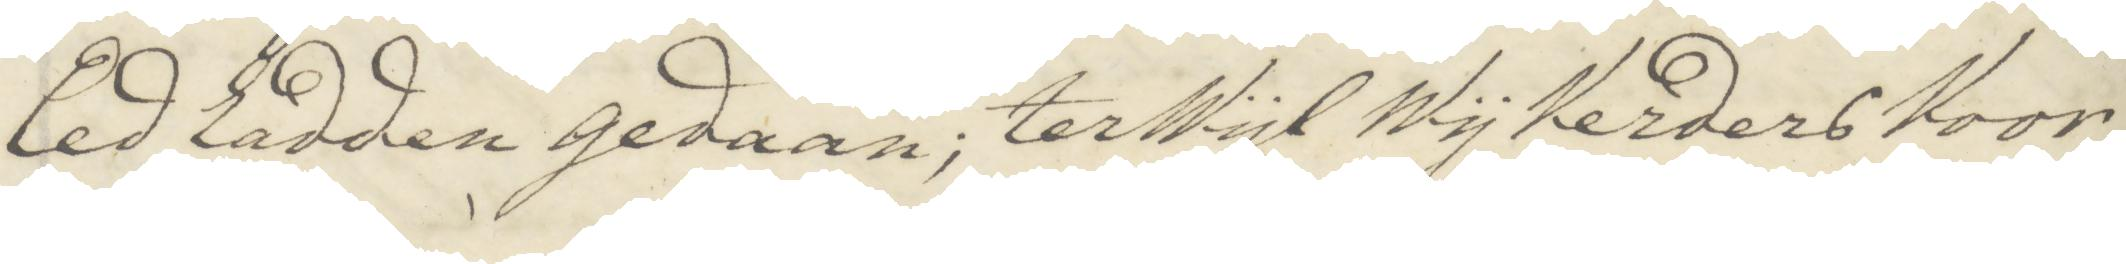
Eed hadden gedaan; terwijl wij verders voor
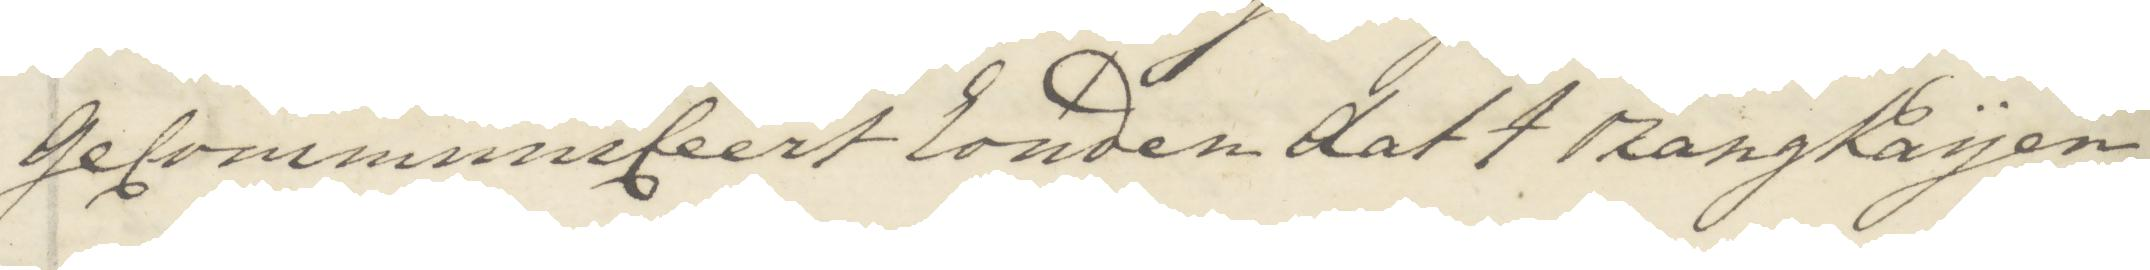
gecommuniceert houden dat ’t orangkaijen
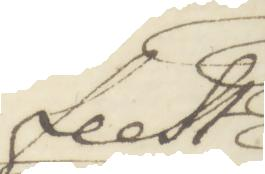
feest
